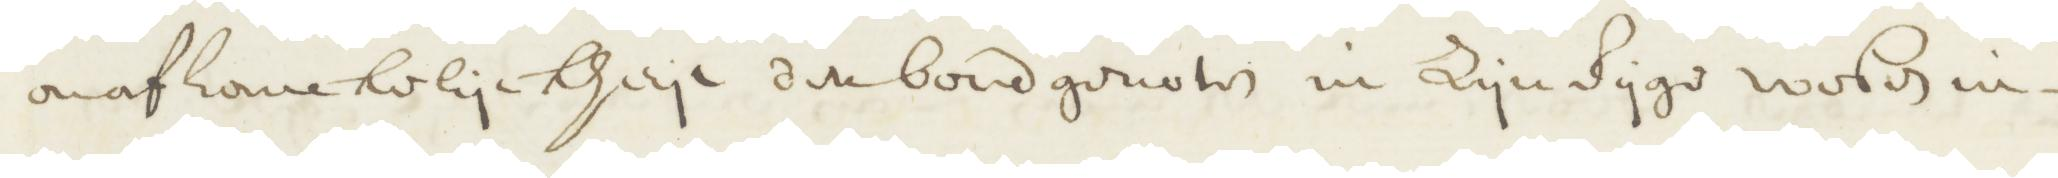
onafhanckelijckheijt der bondgenoten in Zijn Eijge wesen in
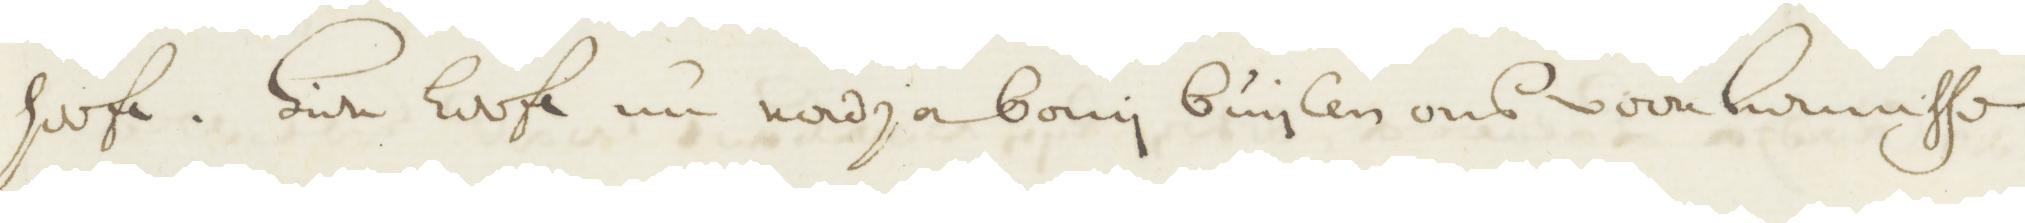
heeft. Hier heeft nu radja bonij buijten ons voorkennisse
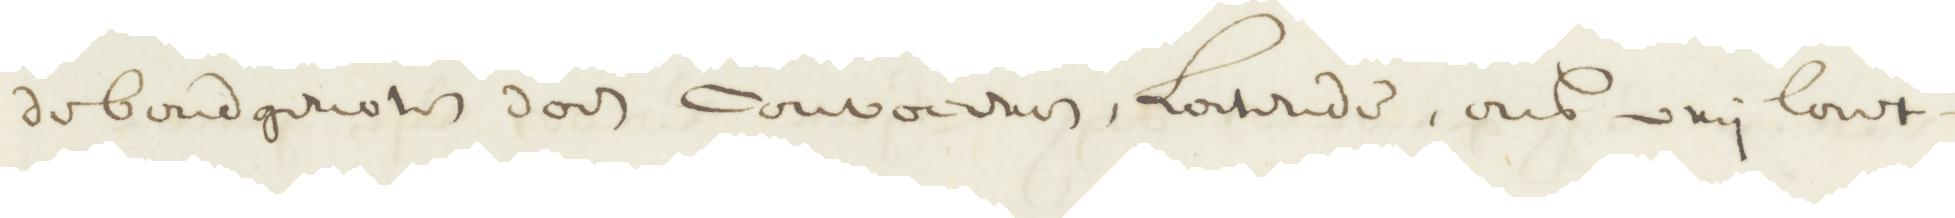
de bondgenoten doen Convoceren, Latende, ons vrij laet
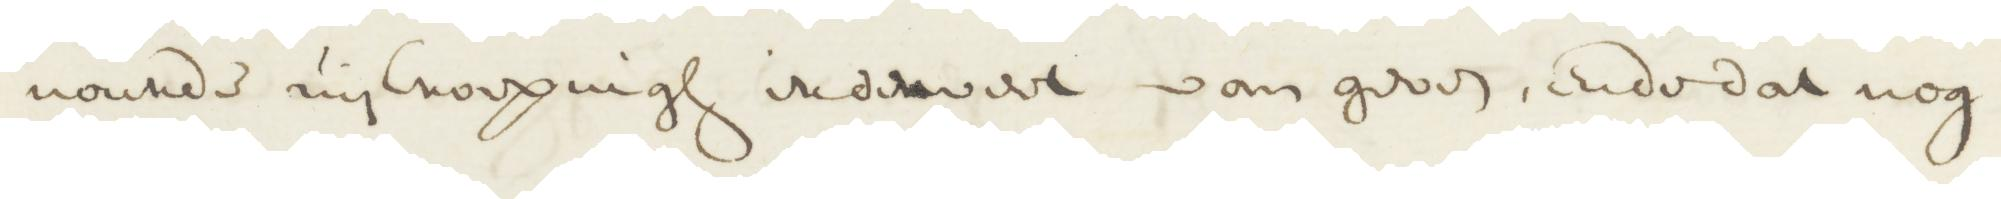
naerde uijtroepingh er den weet van geven, ende dat nog
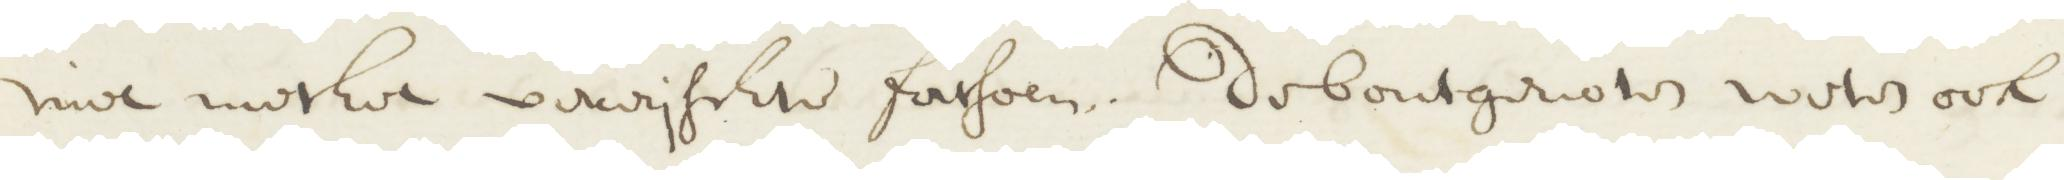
niet met het vereijschte fatsoen,. De bontgenoten weten ook
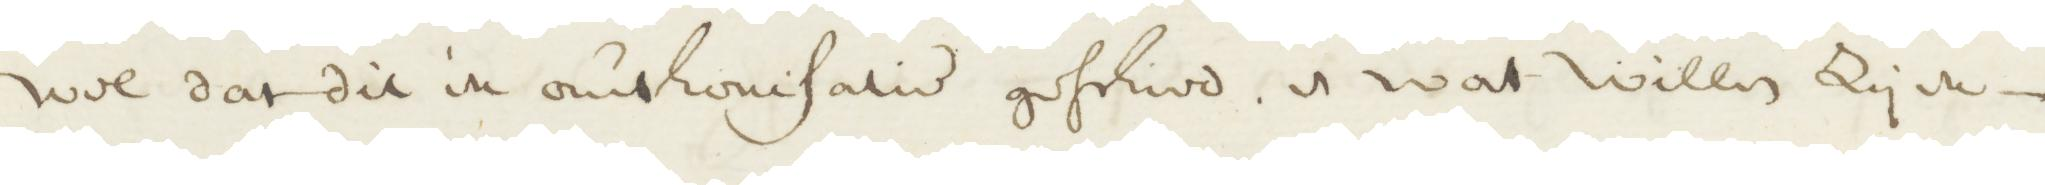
wel dat dit in authorisatie geschied, en wat willen Zij er-
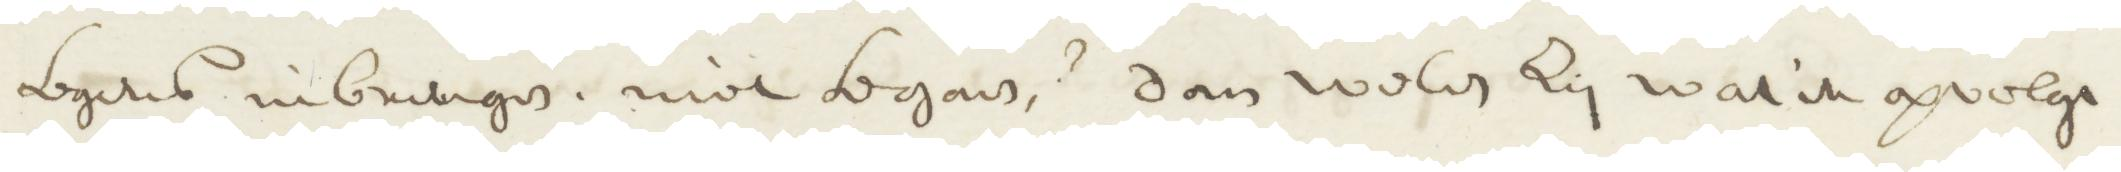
tegens inbrengen, niet te gaen? dan weten Zij wat er op volgt
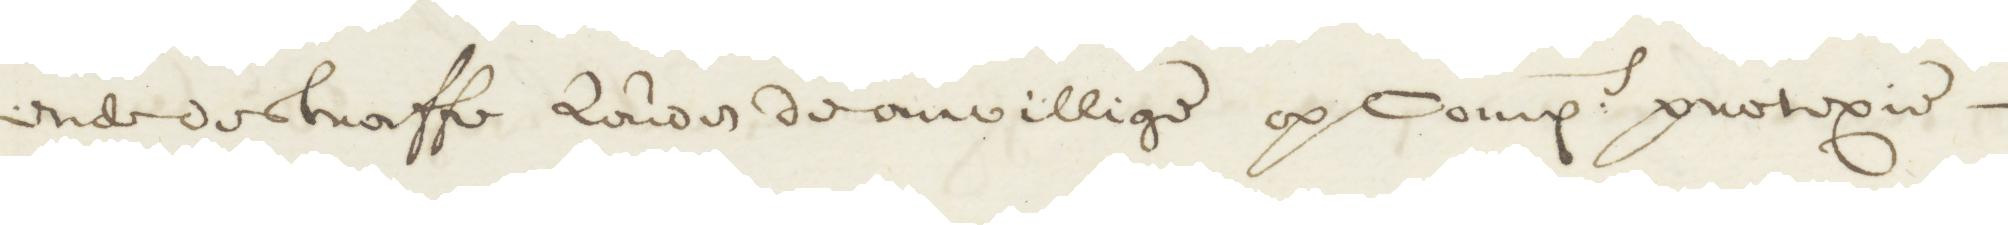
ende de straffe Zouden de onwillige op Comp:s protexie -
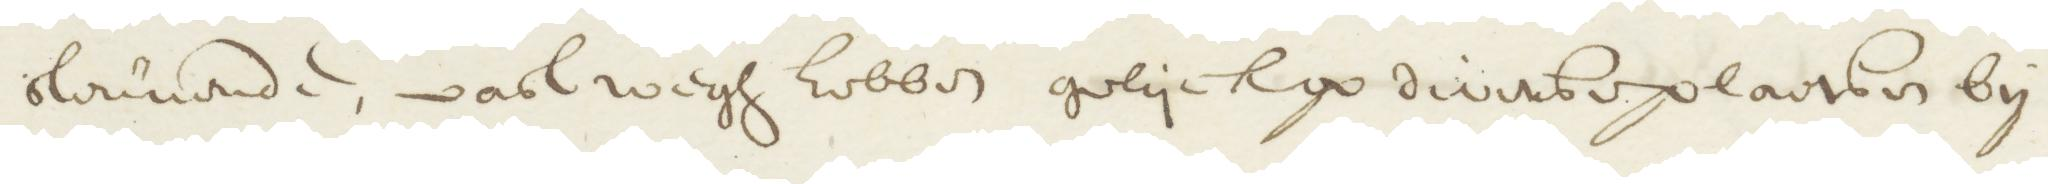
steunende, vast wegh hebben gelijck op diverse plaetsen bij
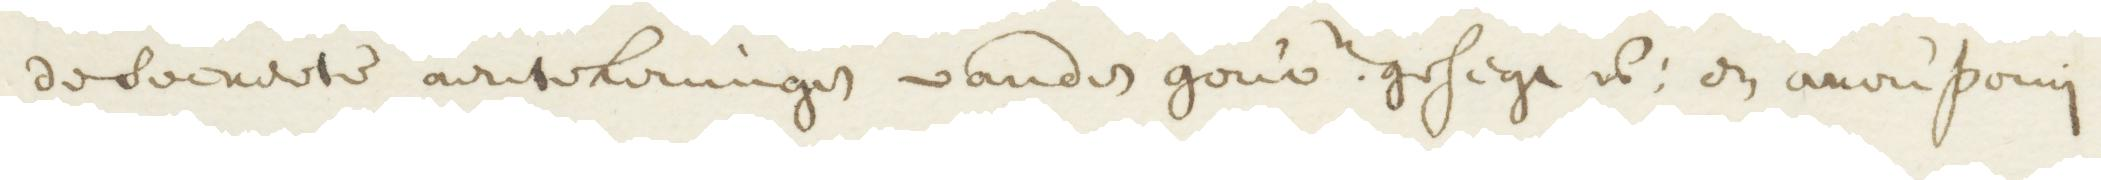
de secreete aentekeningen vanden gouv:r gesegt is; en arou pouij
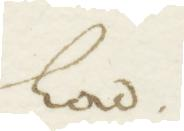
had,
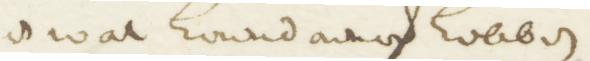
en wat haer daerover hebben
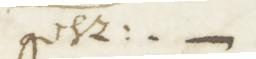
gesz: - —
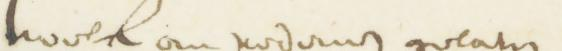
'twelk om redenen gelaten
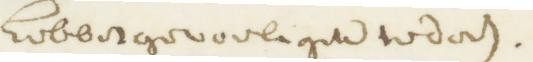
hebben gevoelige te doen.
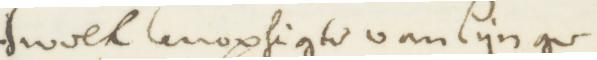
twelk ten opsigte van sijn ge
